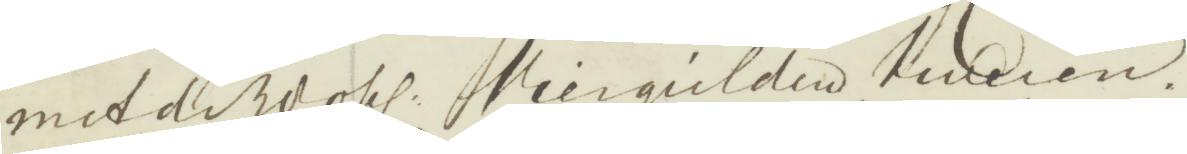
met de 38 opC: Vier gulden tweeen„
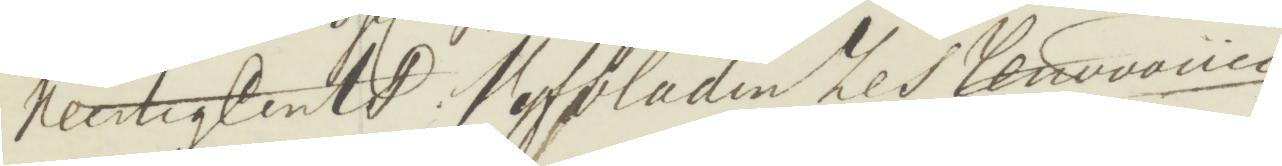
Veertig Cents: Vyf bladen Zes renvooïen
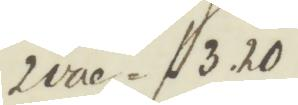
2 vac - ƒ 3.20
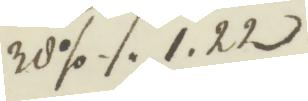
38%. - „ 1.22
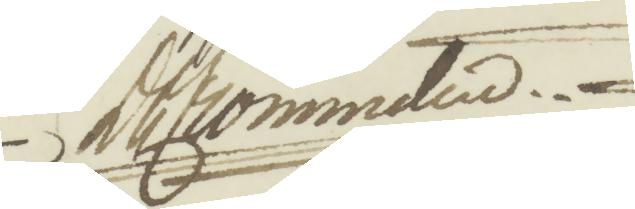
D F Crommelin. -
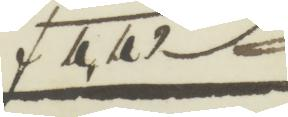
ƒ4,42
